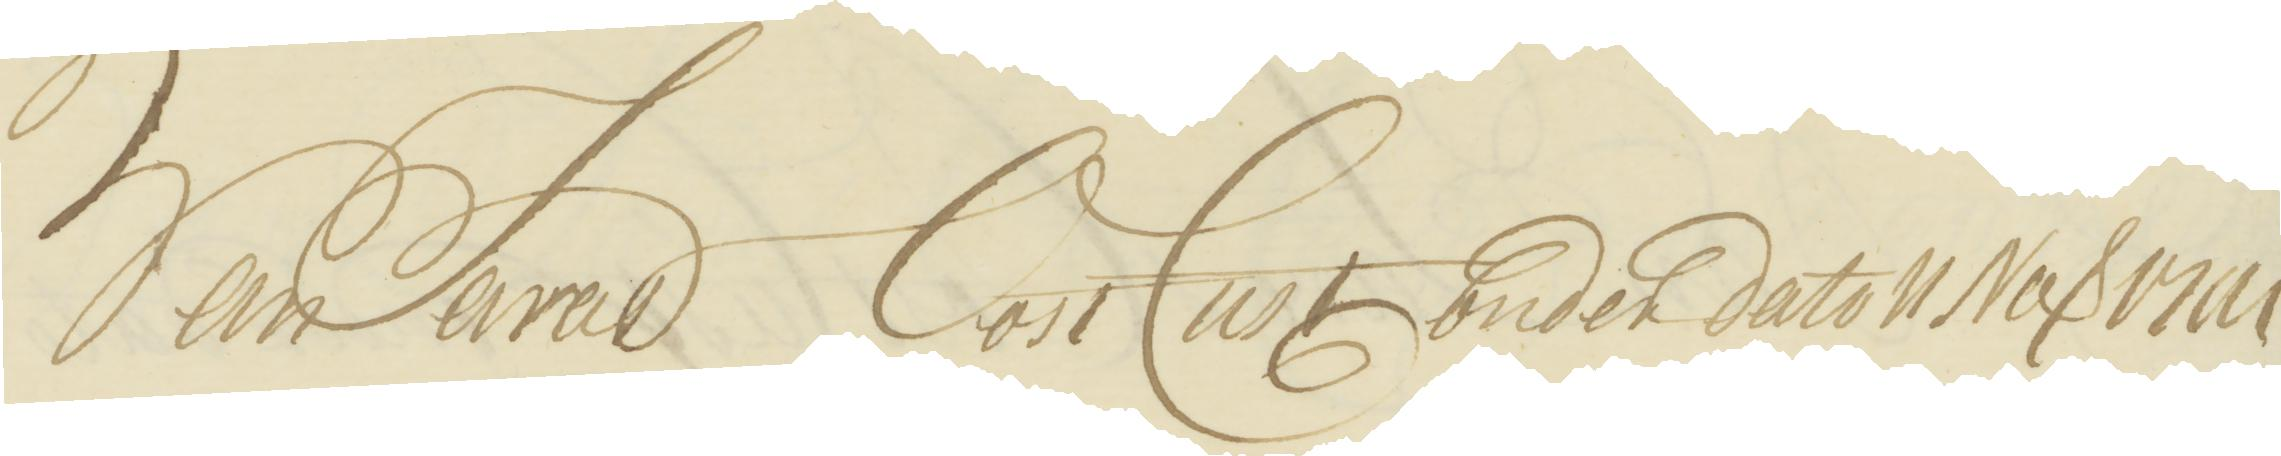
Van Javas Oost Cust onder dato 11 Nover 1741
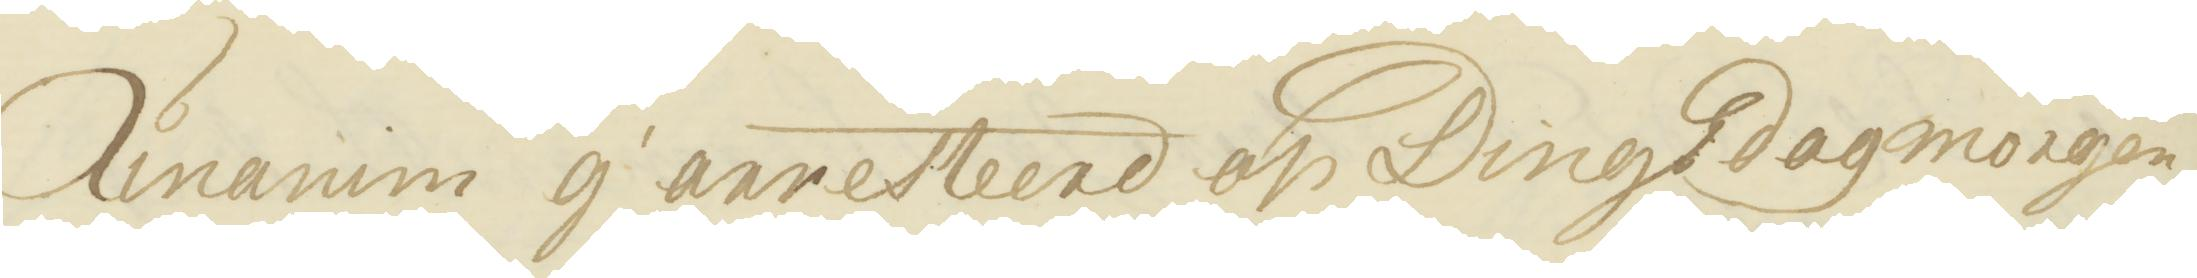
Unanim g’arresteerd op Dingsdagmorgen
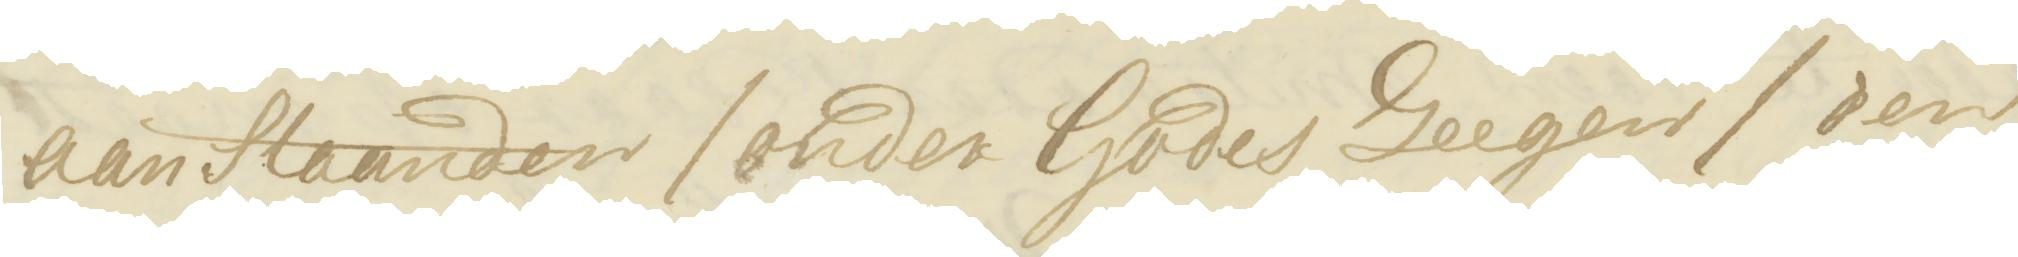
aanstaanden /onder Godes zeegen/ den
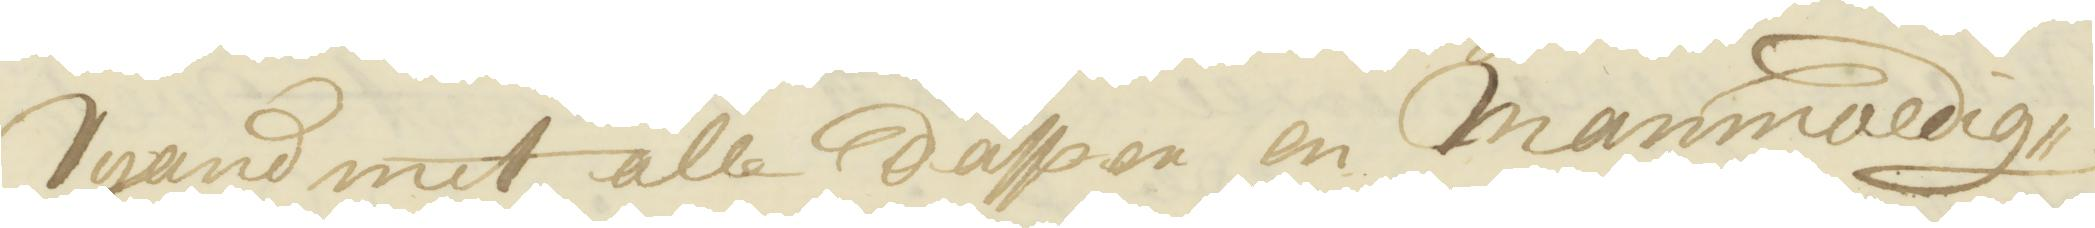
vyand met alle dapper en manmoedig„
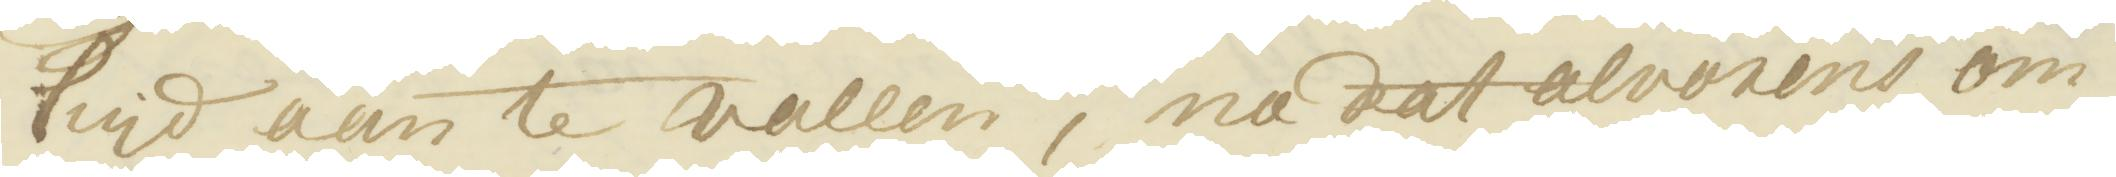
hijd aan te vallen, na dat alvorens om
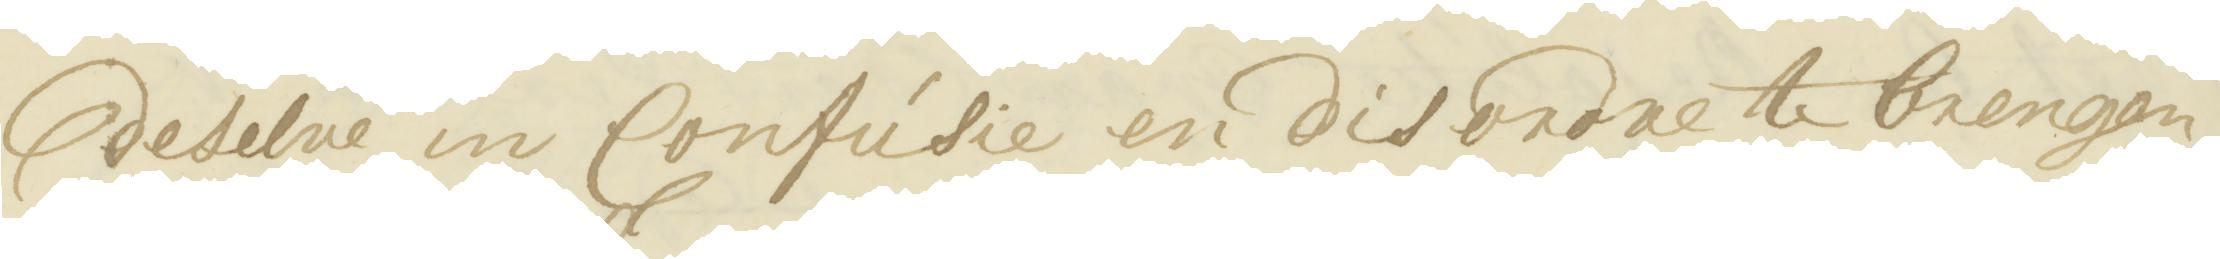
deselve in confusie en disordre te brengen
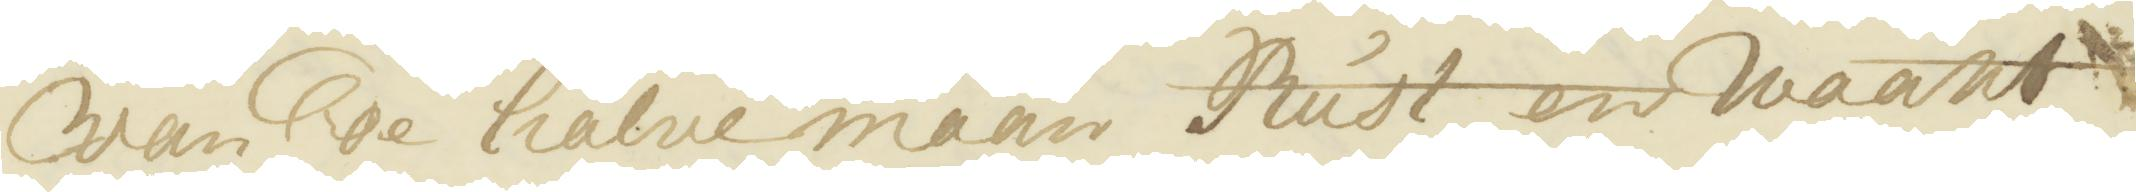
van de halve maan Rust en waart
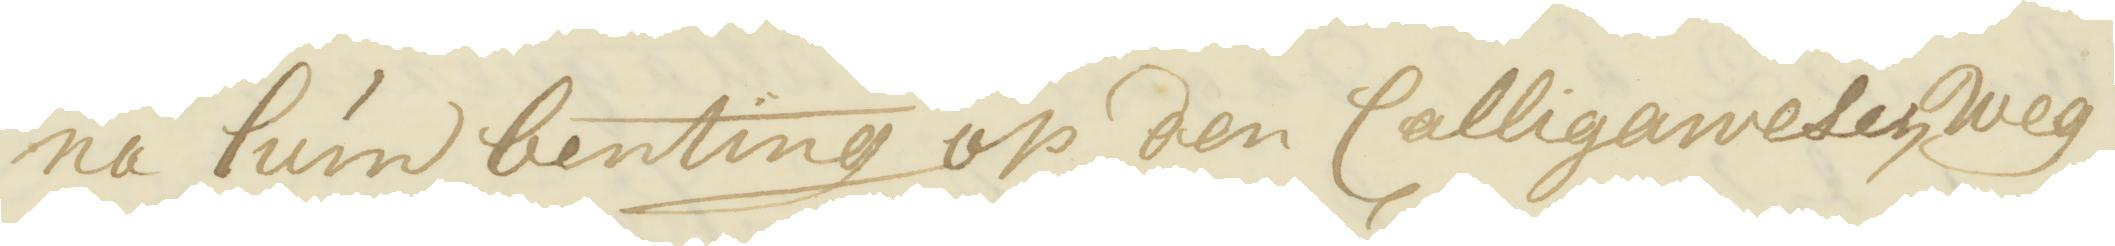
na hun benting op den Calligawesen weg
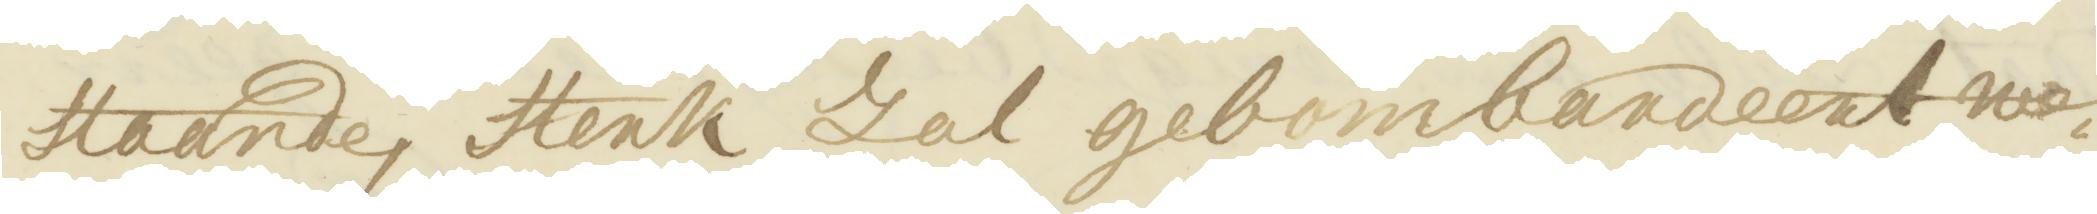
staande, sterk zal gebombardeert we„
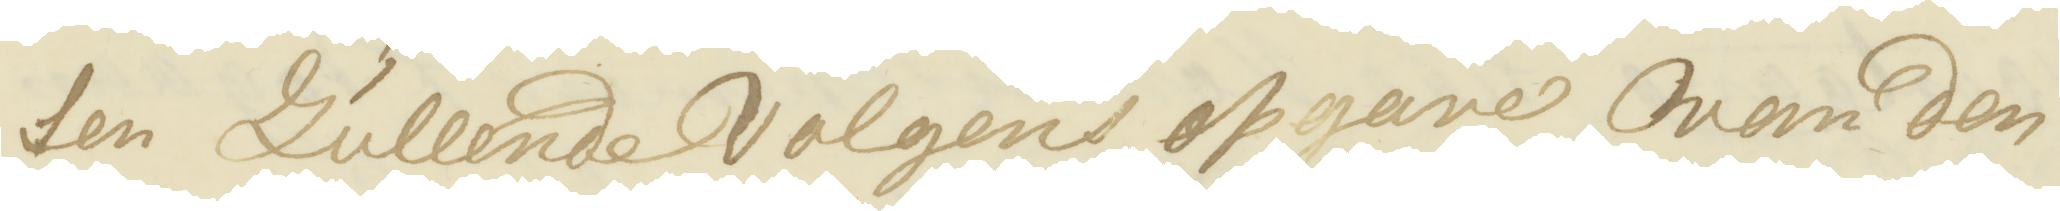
sen zullende volgens opgave van den
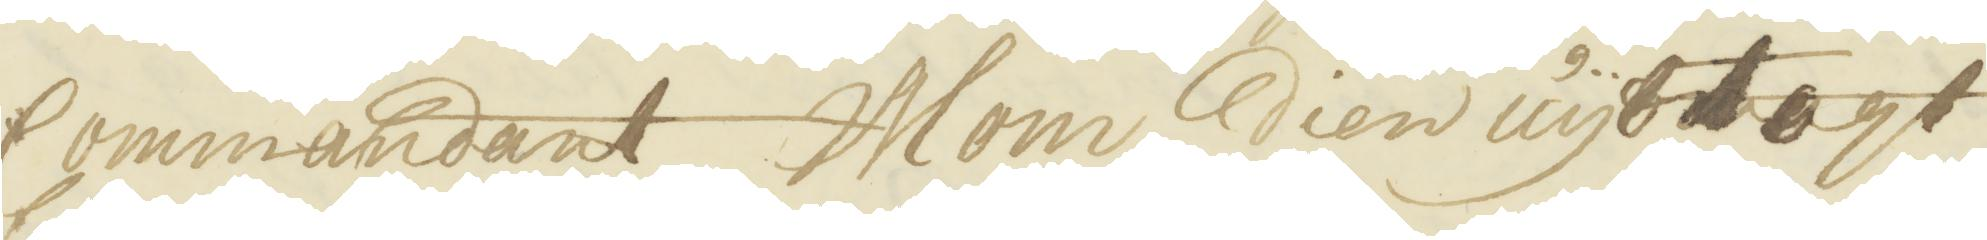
Commandant Mom, dien uijttogt
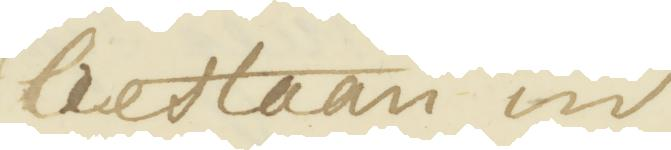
bestaan in
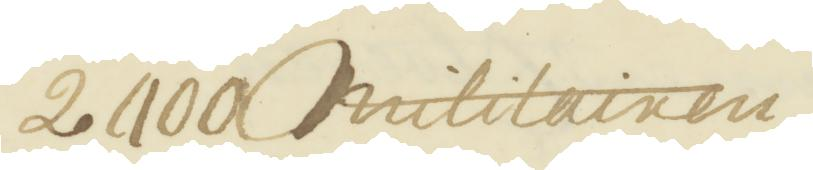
2400 Militairen
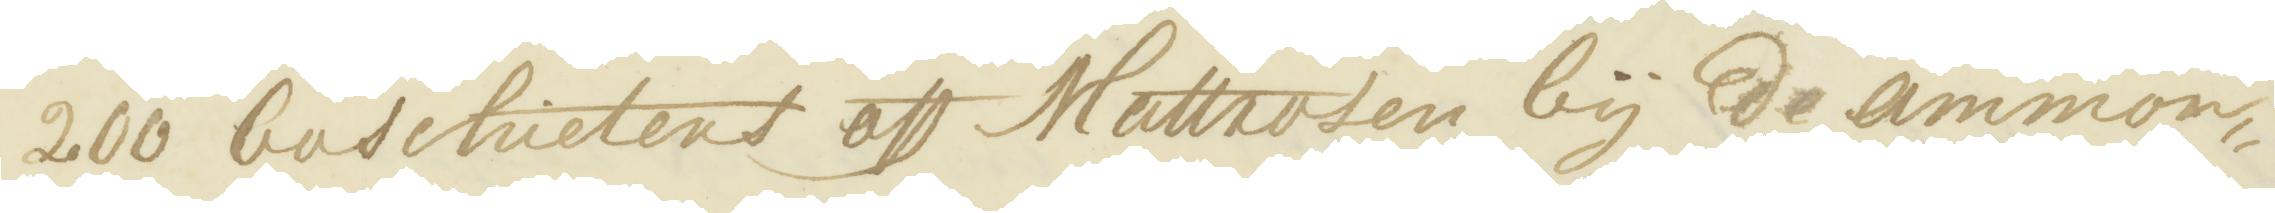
200 boschieters off Mattrosen bij de ammon„
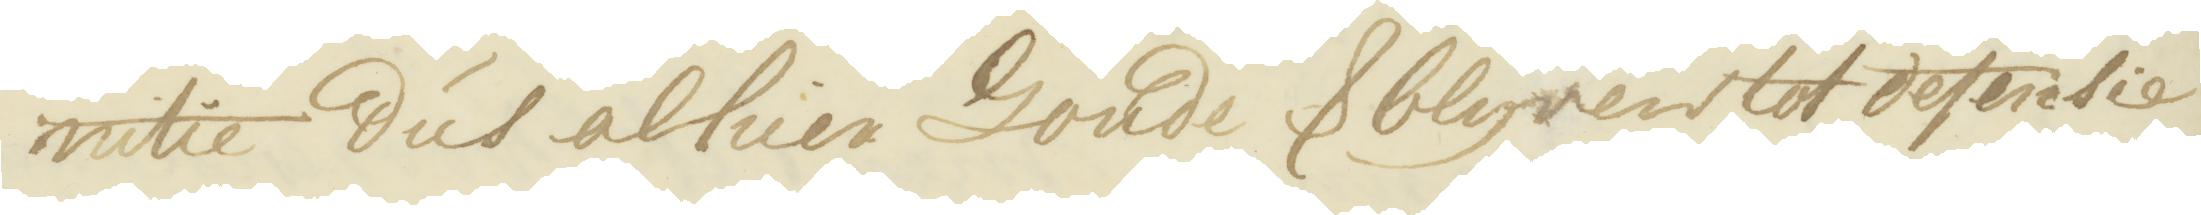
nitie dus alhier zoude verblijven tot defensie
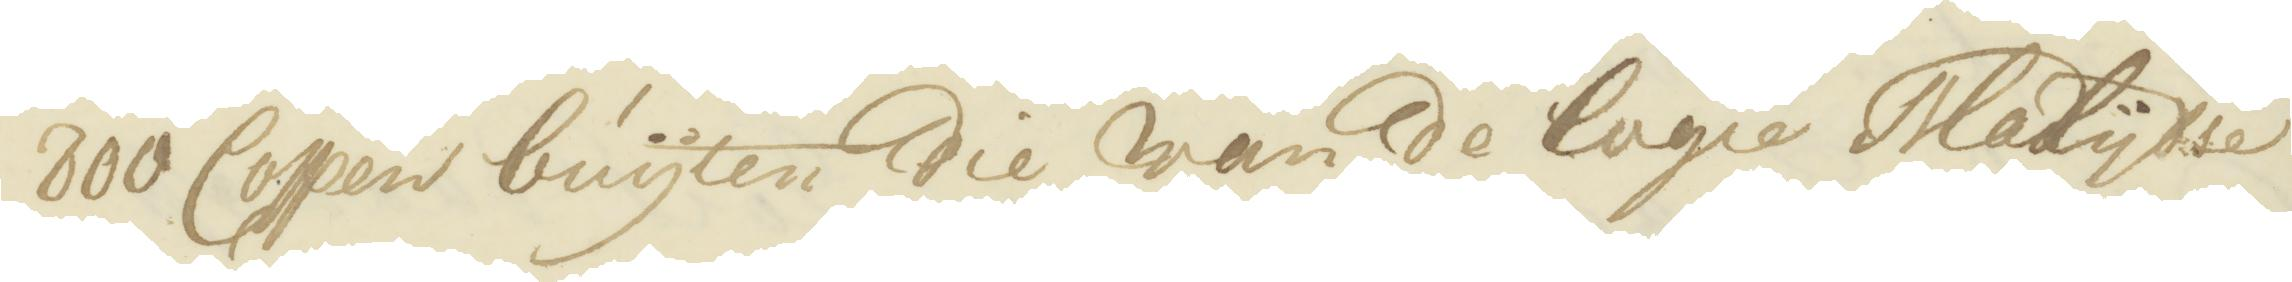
800 Coppen buijten die van de logie Malijtse
